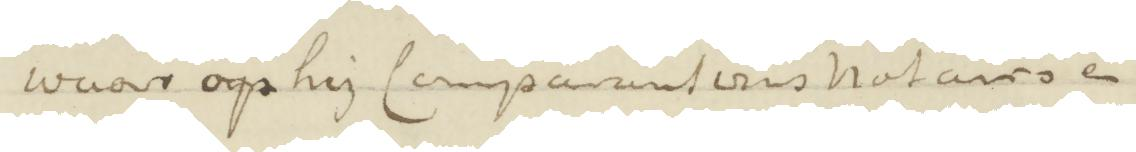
waar op hij Comparant ons Notaris en
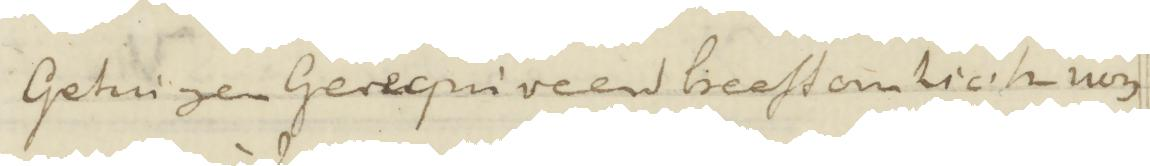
Getuigen Gerequireerd heeft en zich nog
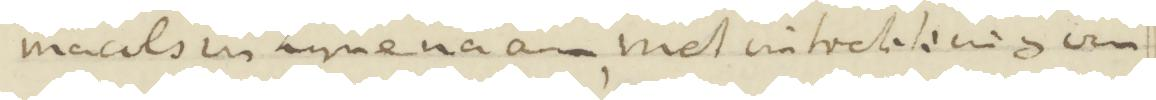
maals in zyne naam, met uitrekking van
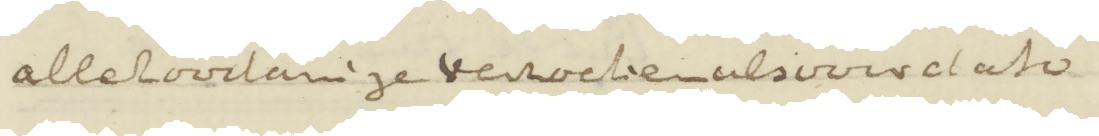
alle zoodanige verzoeken als voor dato
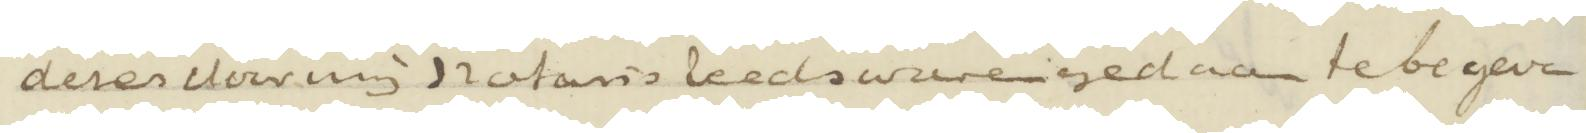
dezes door mij Notaris reeds waren gedaan te begeve
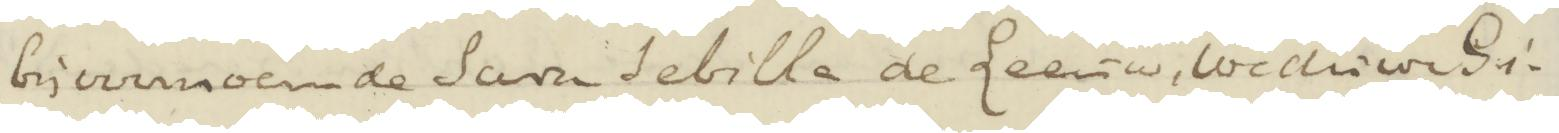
bij voornoemde Sara Sebilla de Leeuw, weduwe hi-
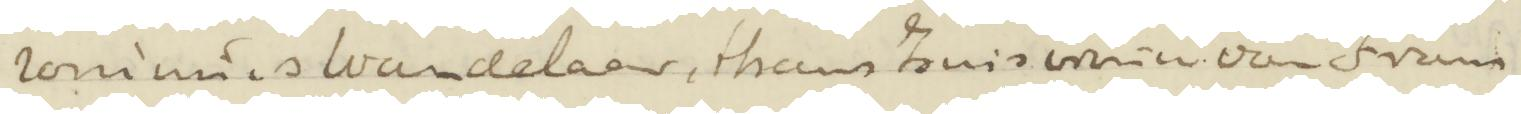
ronimus Wandelaar, thans huisvrouw van Frans
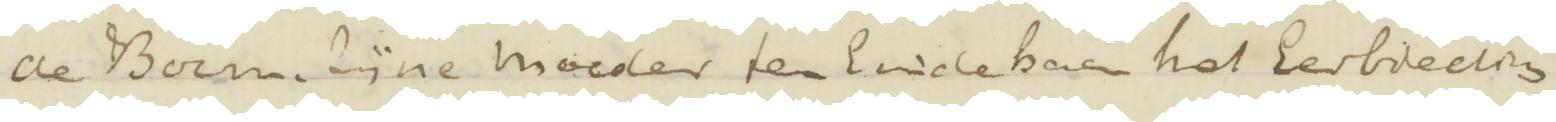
de Boom, zijne moeder ten Einde haar het Eerbiedig
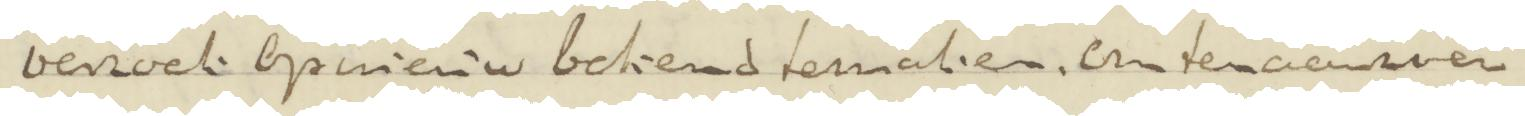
verzoek opnieuw bekend te maken, en ten aanzien
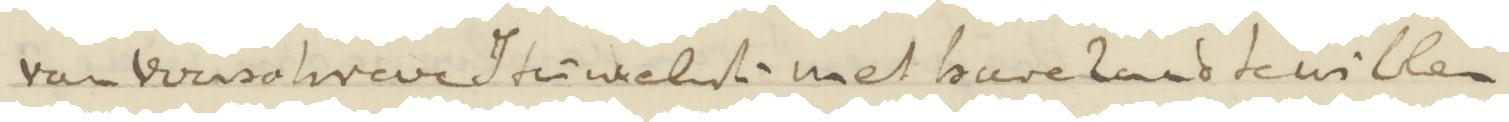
van voorschreve Huwelyk met hare raad te willen
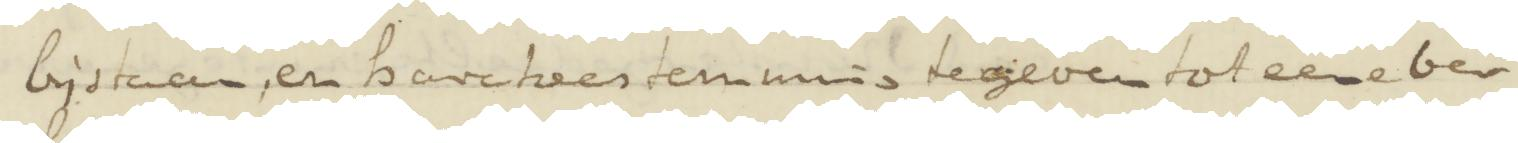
bijstaan, en hare toestemming te geven tot eene ver
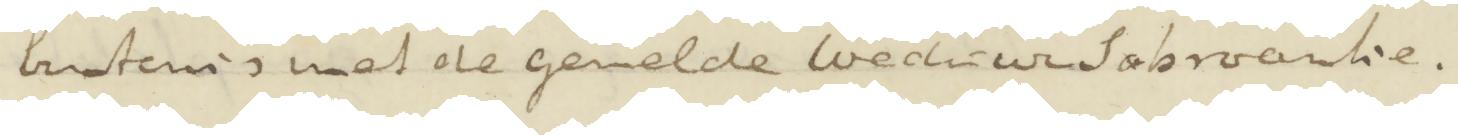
bintenis met de gemelde weduwe sabr vantie.
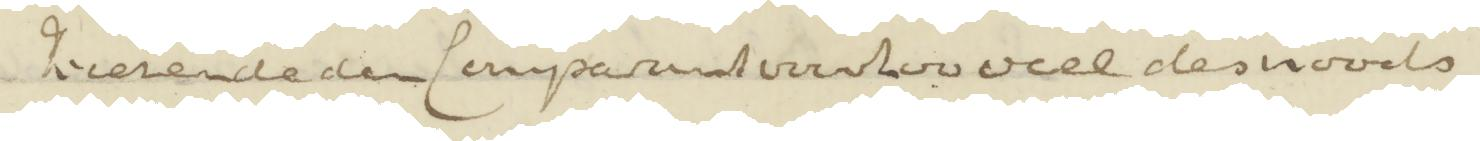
kiezende den Comparant voor zoo veel des noods
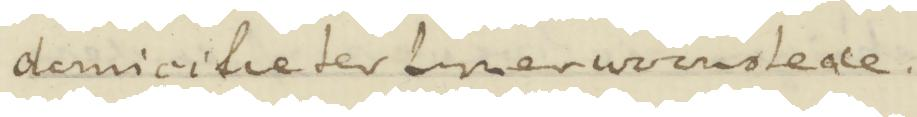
domicilie ter zyner woonstede
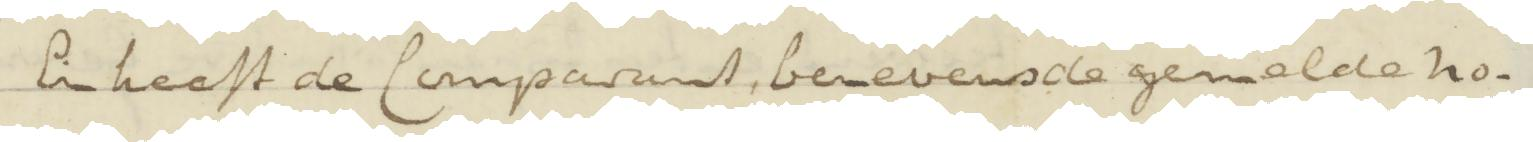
En heeft de Comparant, benevens de gemelde no-
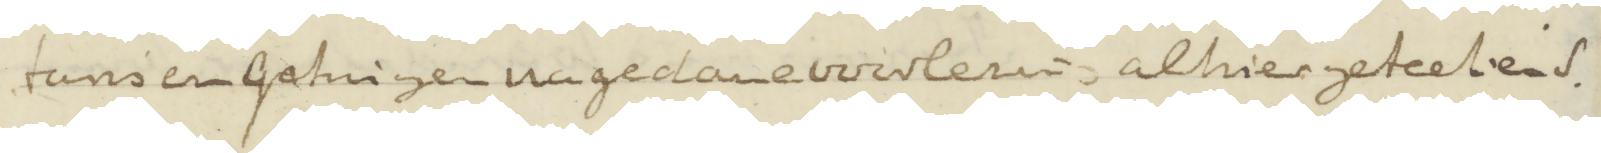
taris en Getuigen na gedane voorlezing alhier geteekend.
